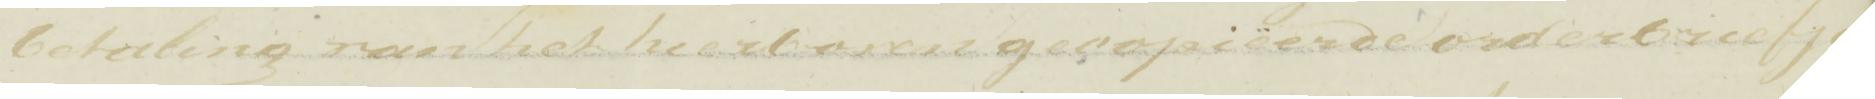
betaling van het hierboven gecopiëerde orderbriefje
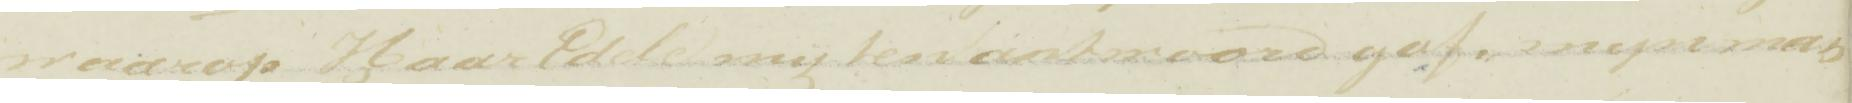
waarop Haar Edele mij ten antwoord gaf „myn man
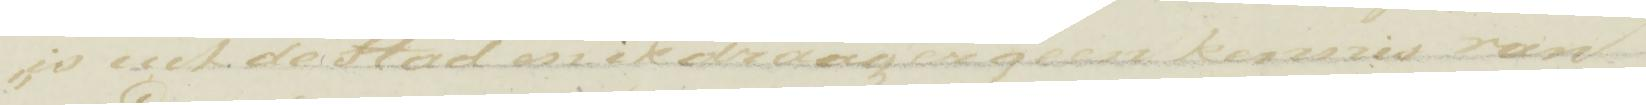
is uit de stad en ik draag er geen kennis van
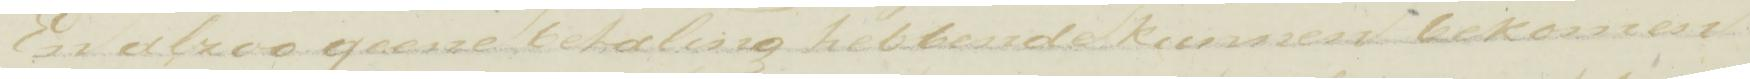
En alzoo geene betaling hebbende kunnen bekomen
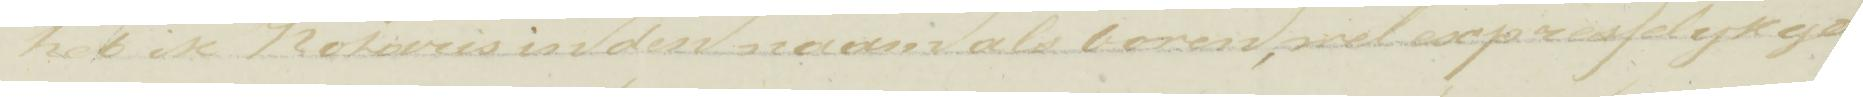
heb ik Notaris in den naam als boven, wel expresselyk ge
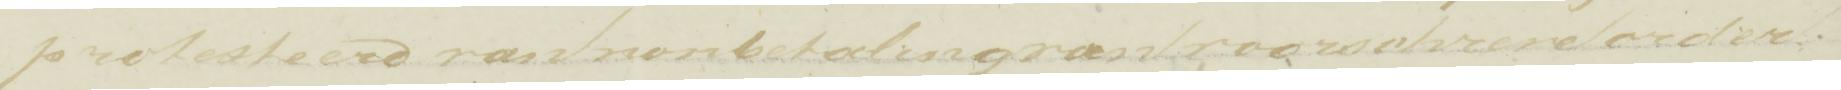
protesteerd van nonbetaling van voorschreve order„
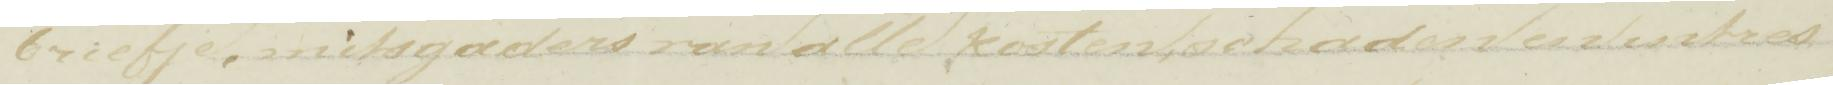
briefje, mitsgaders van alle kosten, schaden en intres
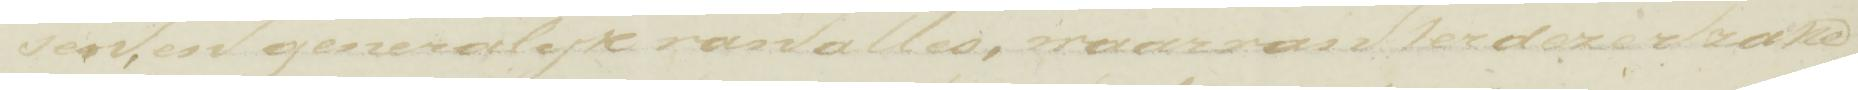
sen, en generalyk van alles, waarvan ter dezer zake
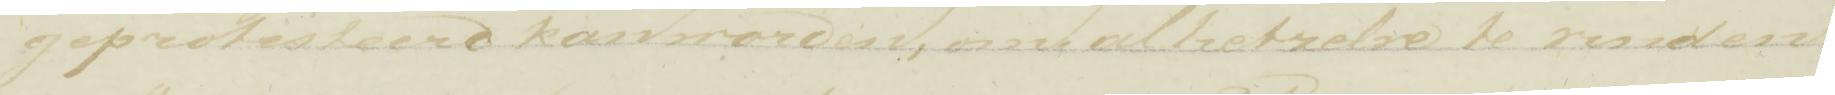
geprotesteerd kan worden, om al hetzelve te vinden
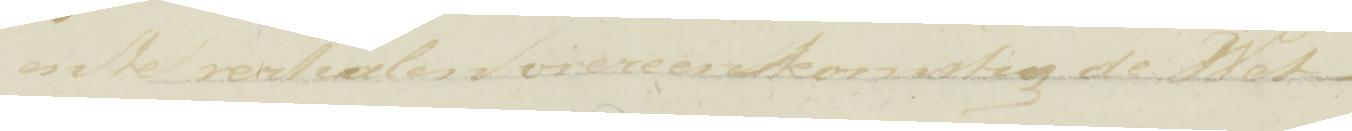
en te verhalen overeenkomstig de Wet
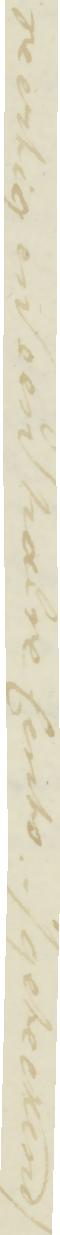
veertig en een halve Cents / geteekend /
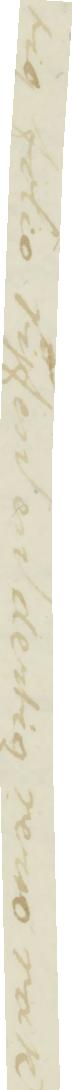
tig folio Vijfen en dertig, verso vak
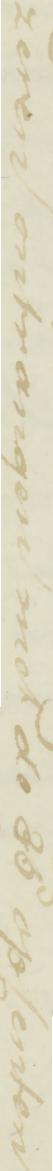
zeven ontvangen met de 35 opcenten
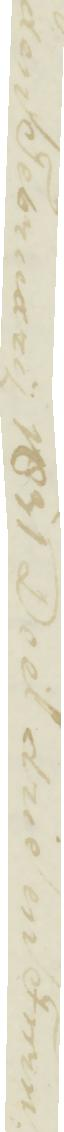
den Februarij 1831 Deel drie en Twin
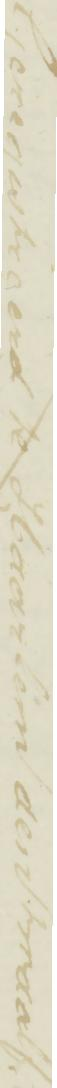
Geregistreerd te Haarlem den twaalf
